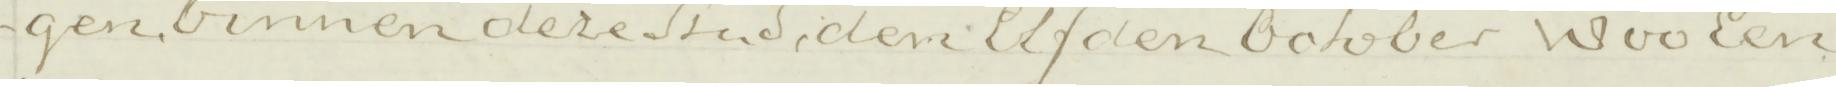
gen binnen deze Stad, den Elfden October 1800 Een
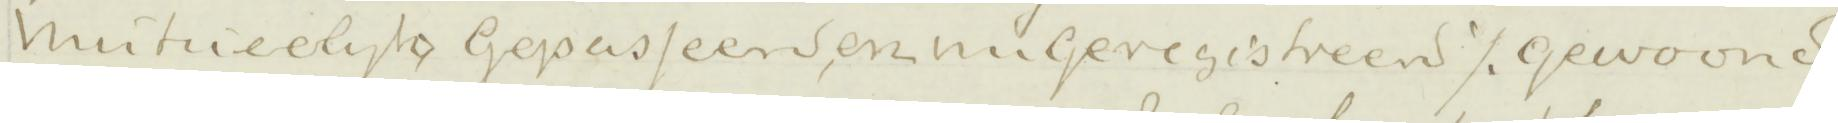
mutueelyk Gepasseerd, en nu Geregistreerd ./. gewoond
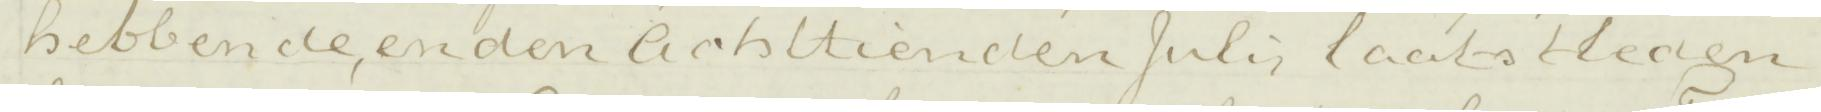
hebbende, en den Achttienden Julij laatstleden
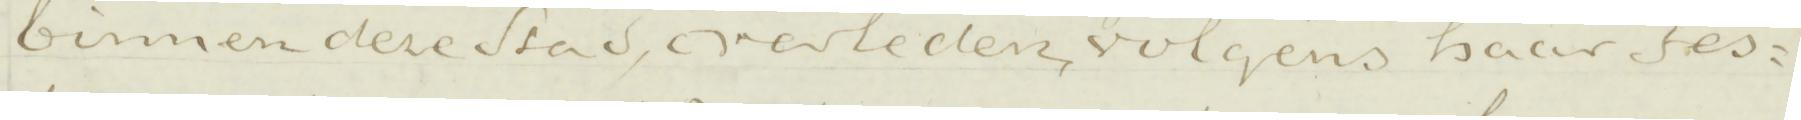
binnen deze stad, overleden volgens haar Tes=
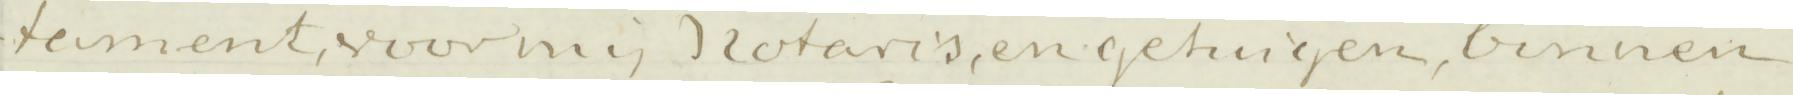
tament, voor mij Notaris, en getuigen, binnen
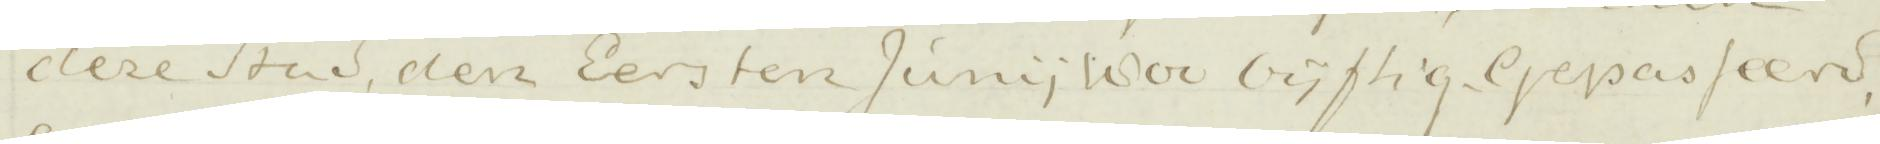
deze stad, den Eersten Junij 1800 vijftig. Gepasseerd
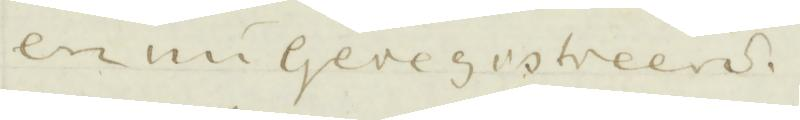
en nu Geregistreerd.
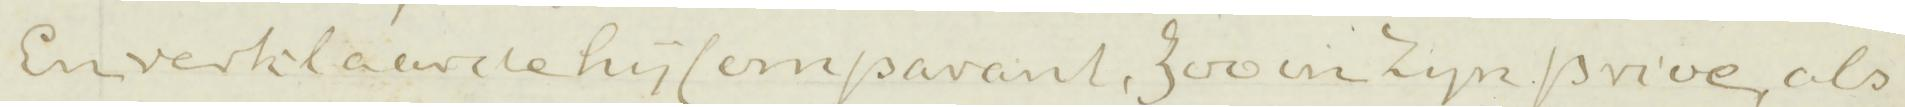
En verklaarde hij Comparant, zoo in zyn prive, als
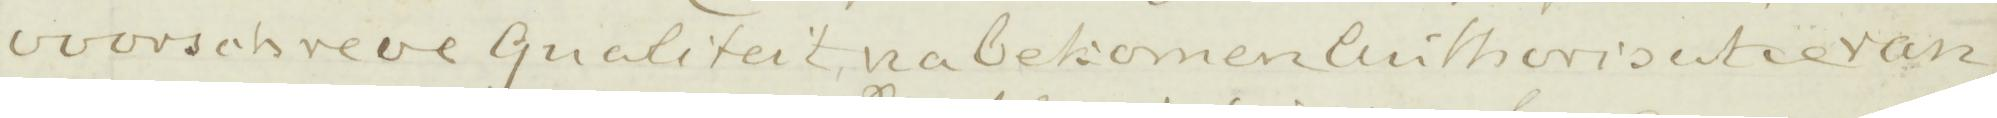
voorschreve qualiteit, nabekomen authorisatie van
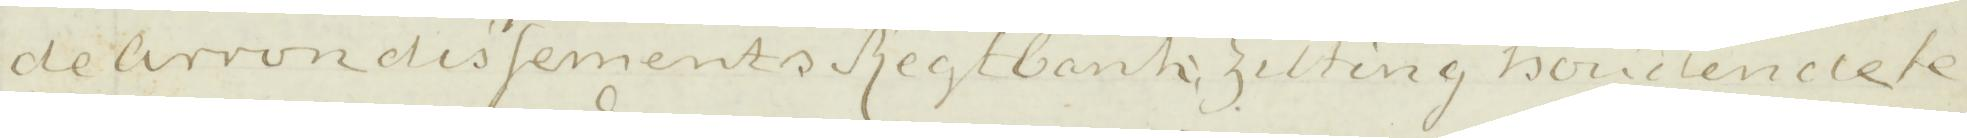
de arrondissements Regtbank zitting houdende te
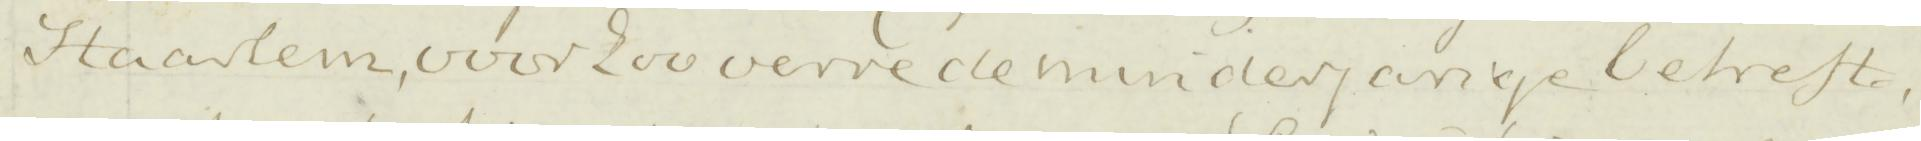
Haarlem, voor zoo verre de minderjarige betreft,
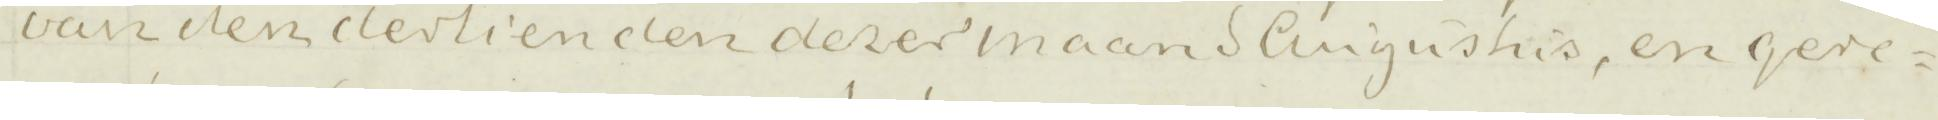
van den dertienden dezer maand Augustus, en gere=
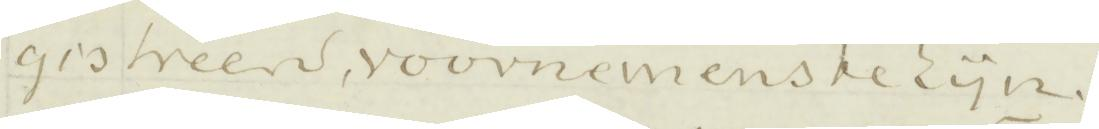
gistreerd, voornemens te zijn.
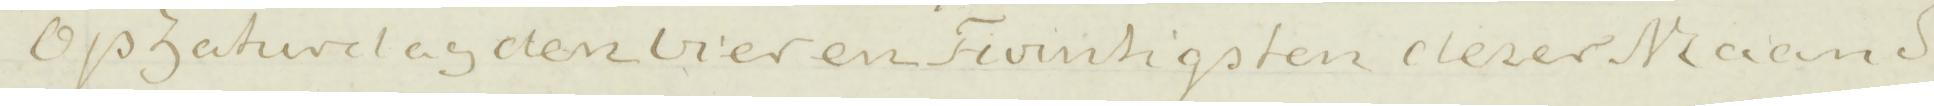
Op Zaturdag den vier en Twintigsten dezer Maand
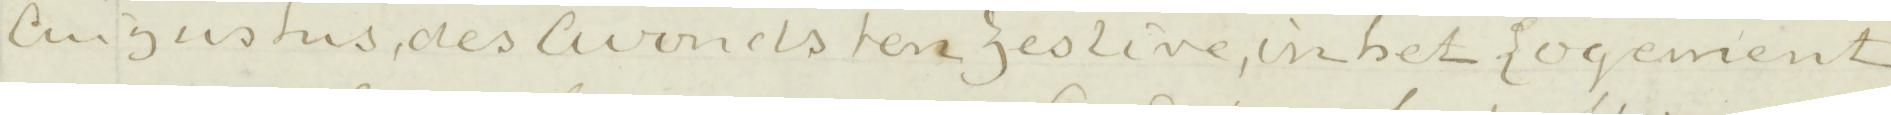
Augustus, des Avonds ten zes ure, in het Logement
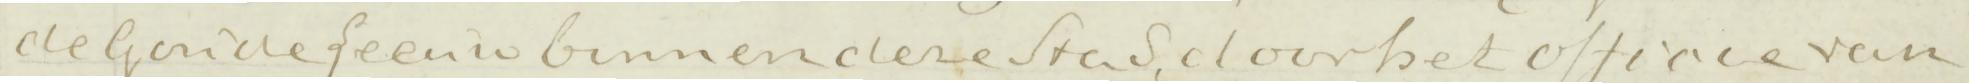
de Goude Leeuw binnen deze stad, door het officie van
